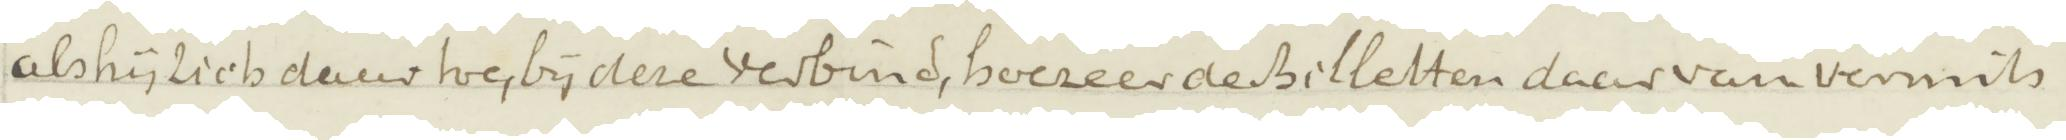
als hij zich daar toe, bij deze verbind, hoezeer de Billetten daar van vermits
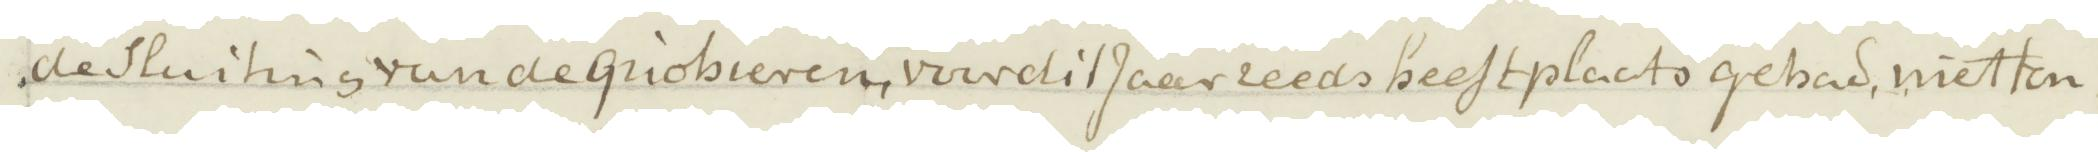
de sluiting van de quotieren, voor dit Jaar reeds heeft plaats gehad, niet ten
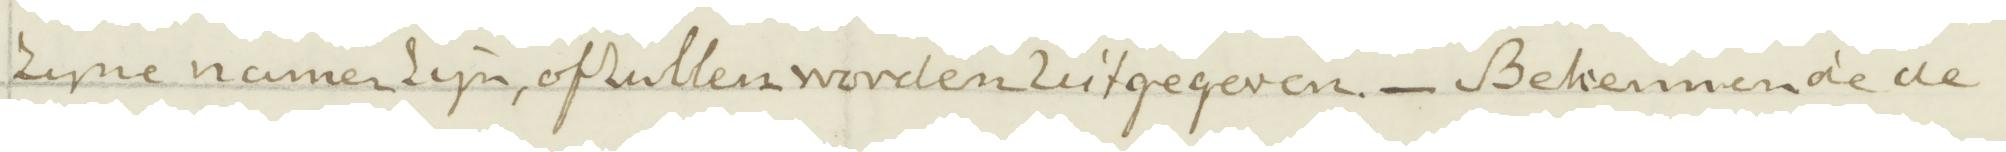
zyne namen zijn, of zullen worden uitgegeven. — Bekennende de
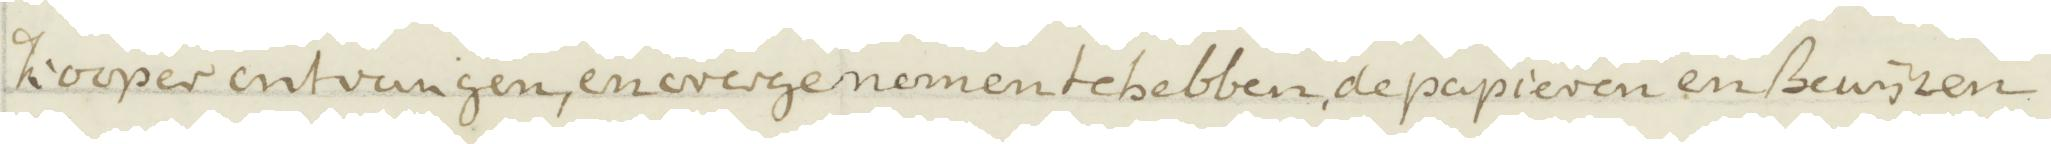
kooper ontvangen, en overgenomen te hebben, de papieren en Bewijzen
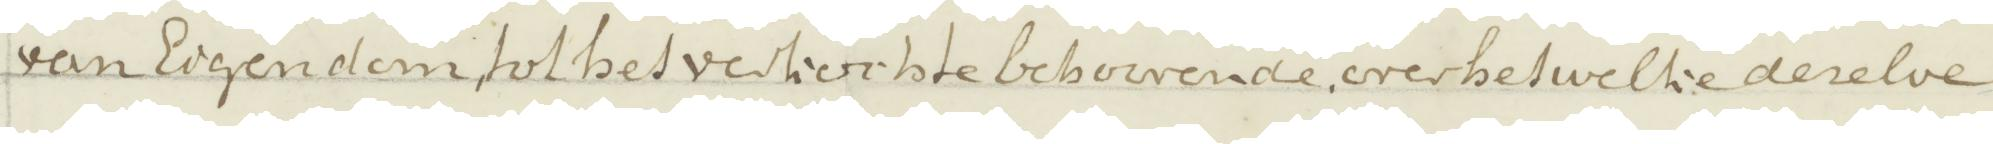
van Eigendom, tot het verkochte behoorende, over het welke dezelve
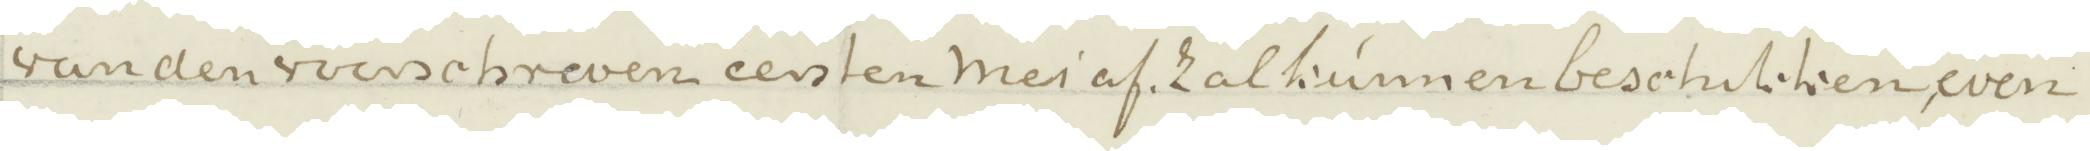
van den voorschreven eersten mei af, zal kunnen beschikken, even
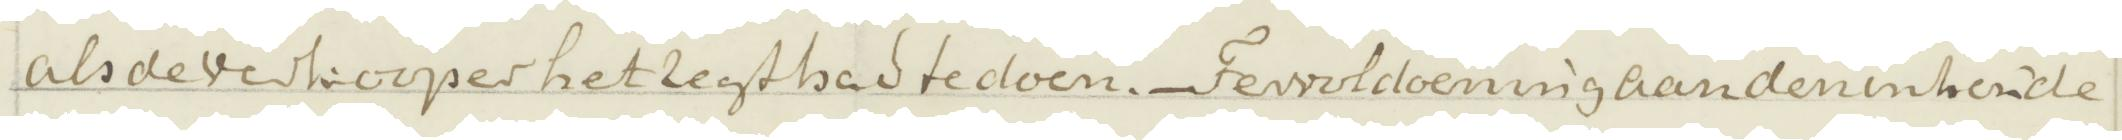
als de verkooper het regt had te doen. — Tervoldoening aan den inhoude
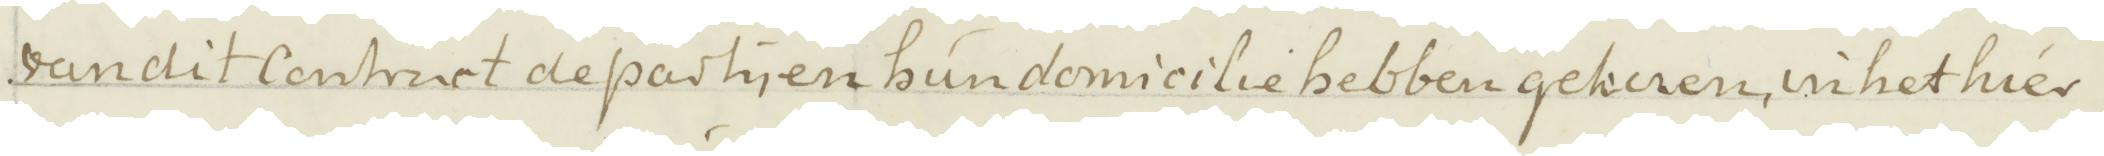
van dit Contract de partijen hun domicilie hebben gekozen, in het hier
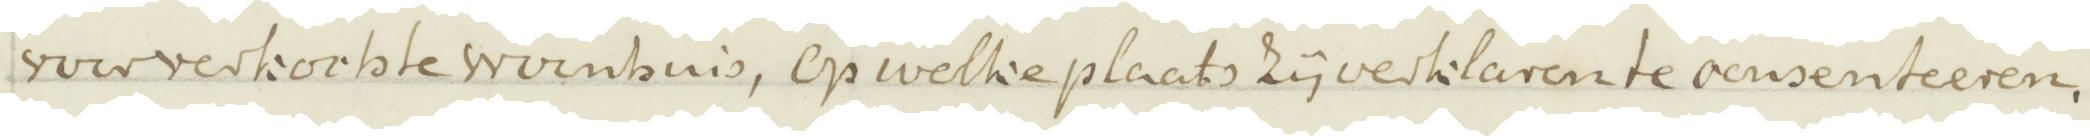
voor verkochte woonhuis, op welke plaats zij verklaren te consenteeren,
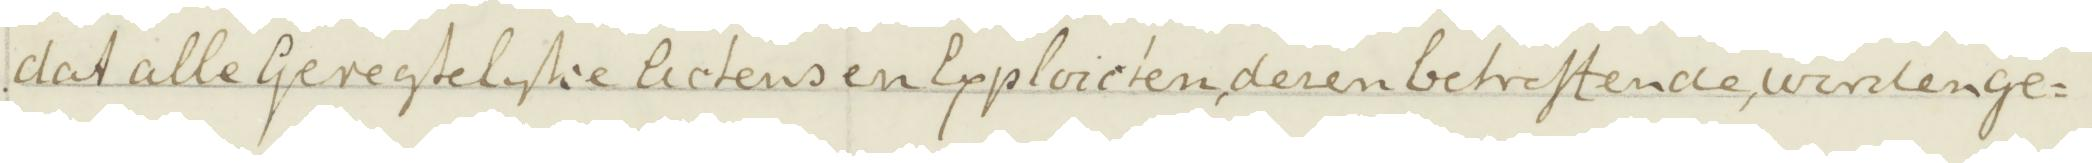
dat alle Geregtelyke Actens en Exploicten, dezen betreffende, worden ge=
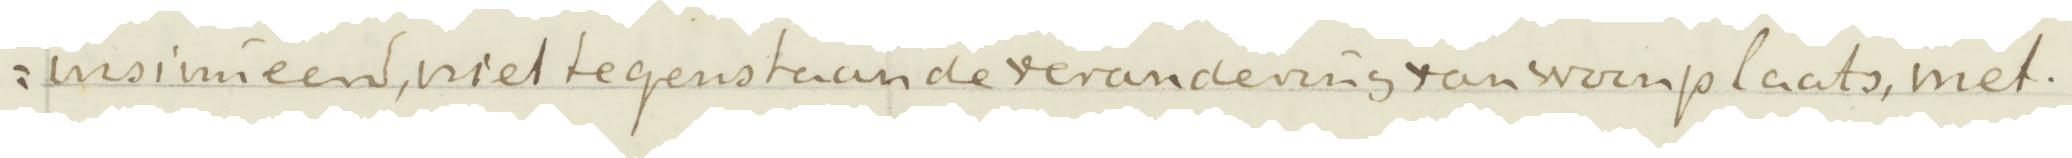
=insinueerd, niet tegenstaande verandering van woonplaats, met
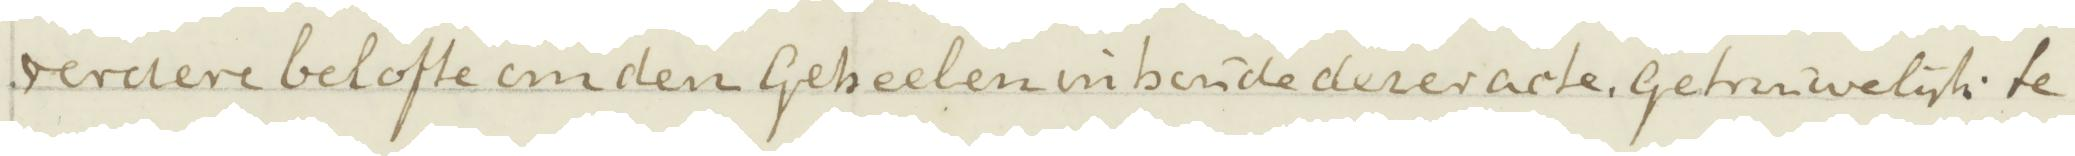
verdere belofte om den Geheelen in hande dezer acte, Getrouwelijk te
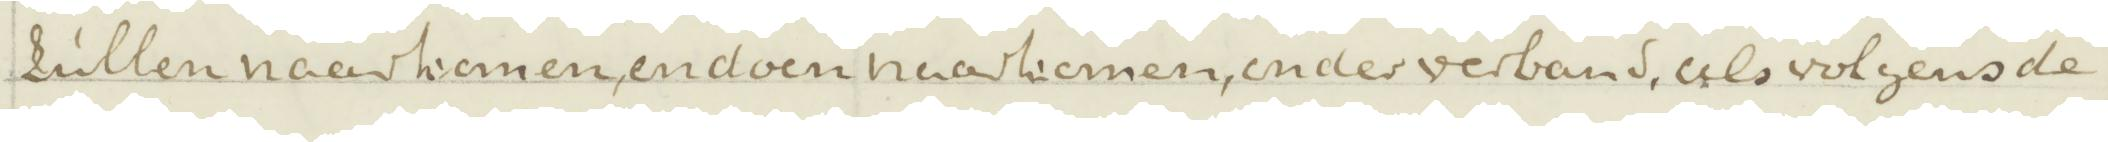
zullen naarkomen, en doen naarkomen, onder verband, als volgens de
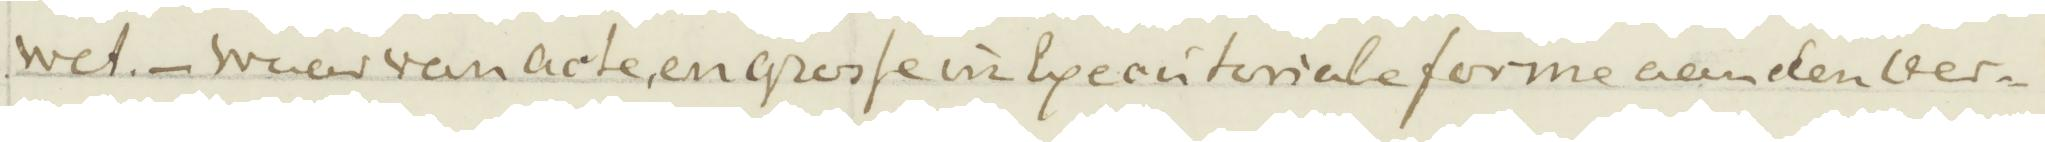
wet. — waarvan acte, en grosse in Executoriale forme aan den ver=
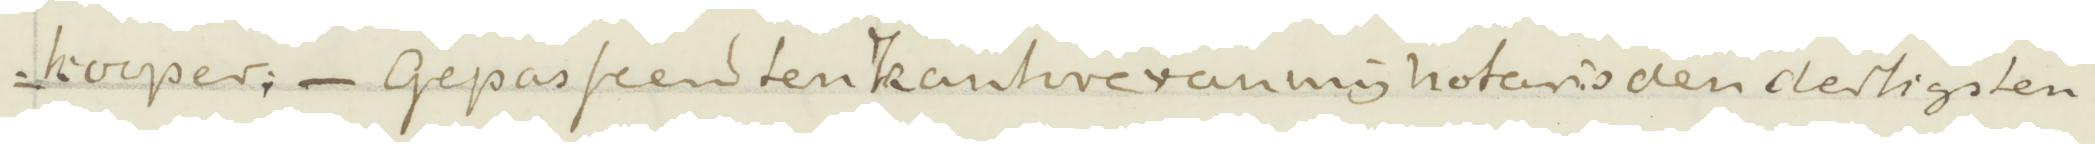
=kooper: — Gepasseerd ten kantore van mij notaris den dertigsten
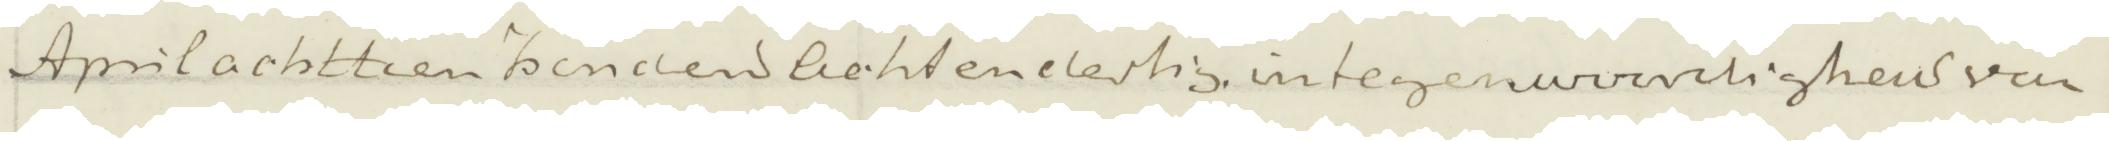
April achttien honderd acht en dertig, in tegenwoordigheid van
